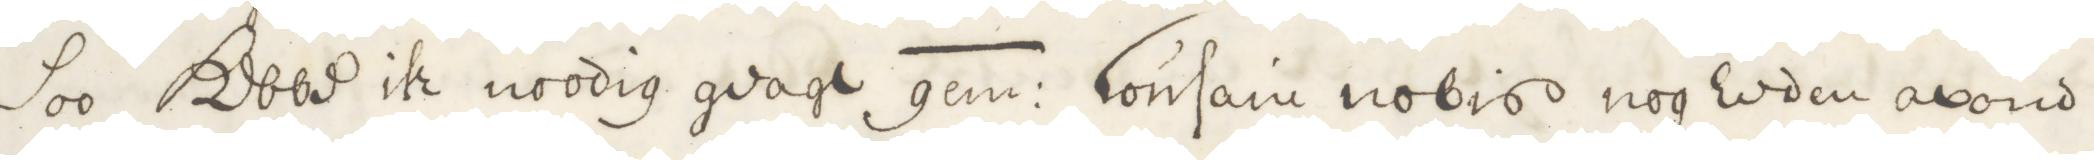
soo Hebbe ik noodig geagt gem: tousain nobis nog heden avond
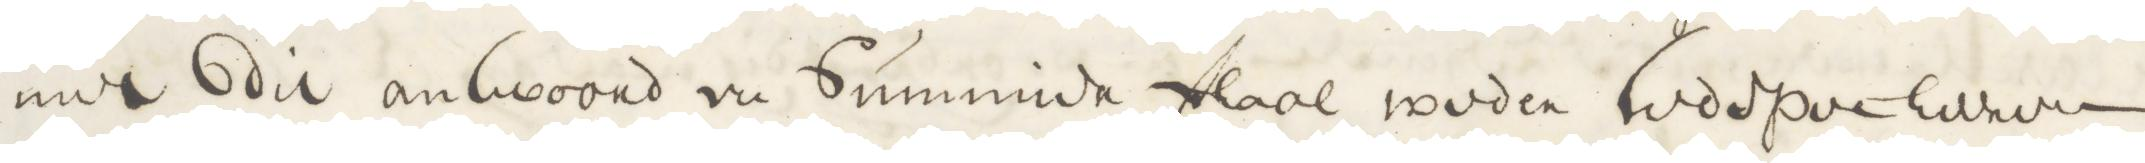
met dit antwoord en summier verhaal weder tedepecheeren
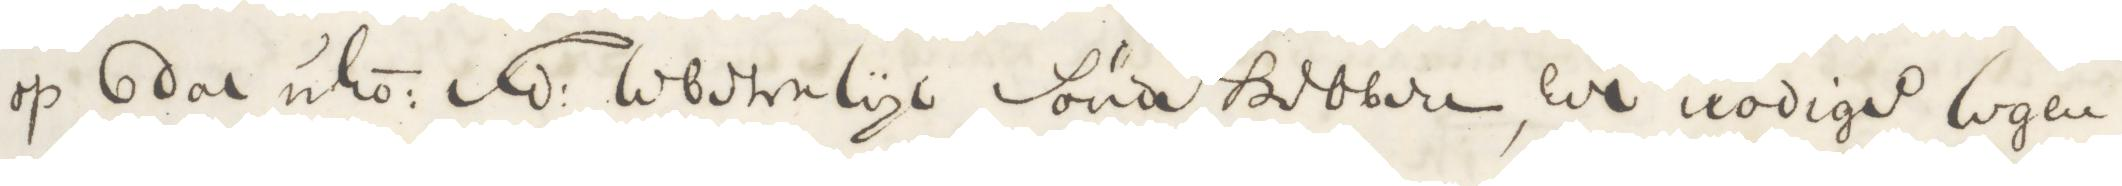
op dat uho: Ed: te beter tijt soude hebben, het nodige tegen
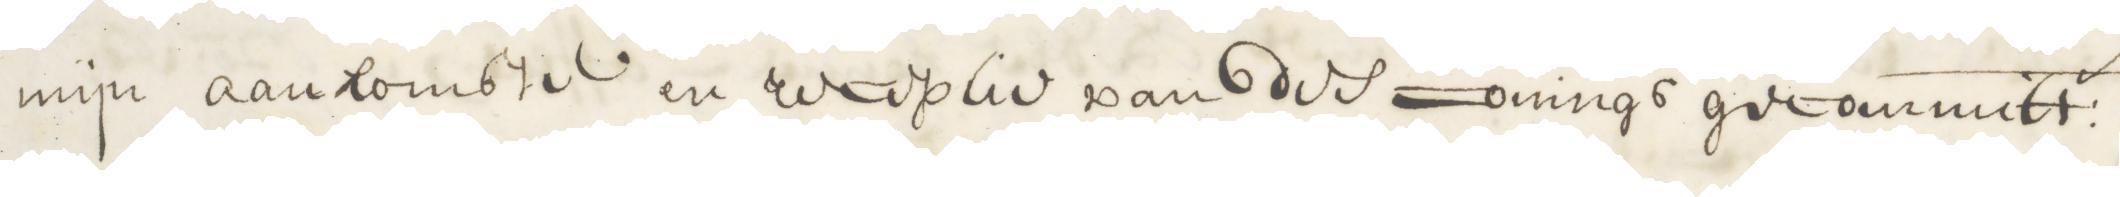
mijn aankomste en receptie van des conings gecommitts:
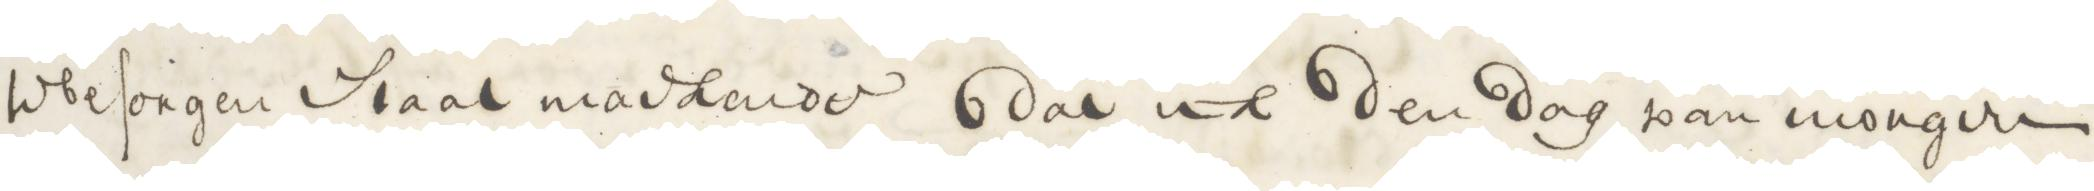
tebesorgen staat maekende dat ick den dag van morgen
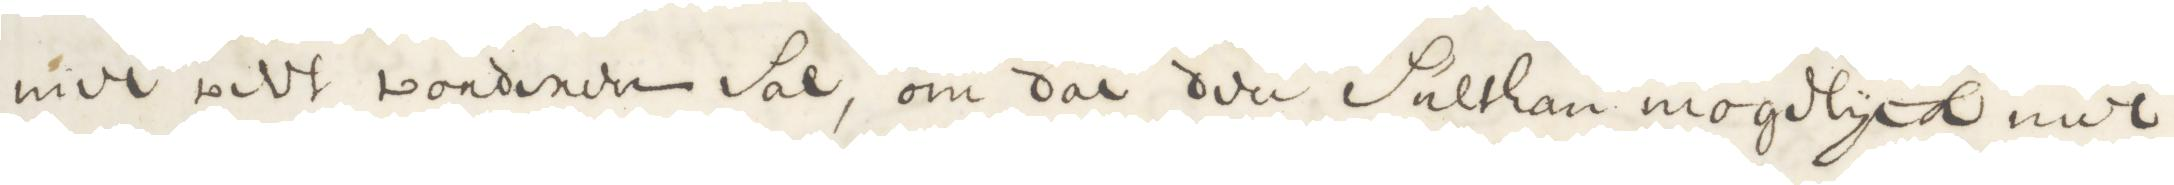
niet veel vorderen sal, om dat den sulthan mogelijck niet
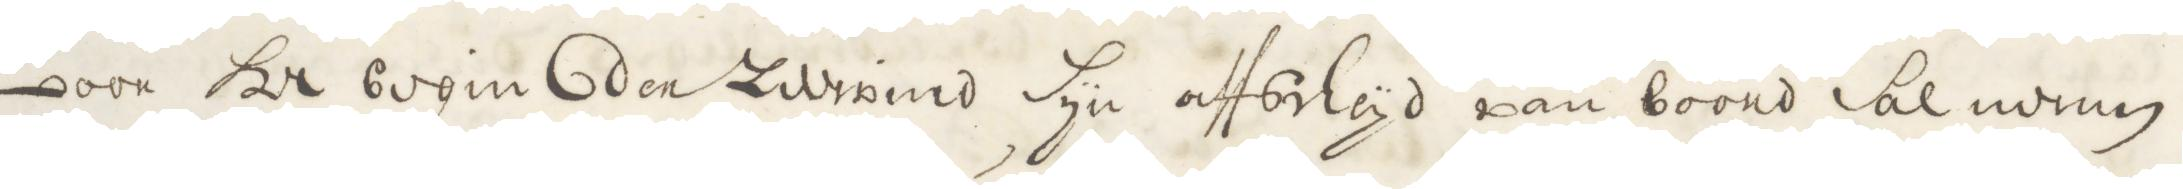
voor het begin der zeewind sijn affscheijd van boord sal nemen
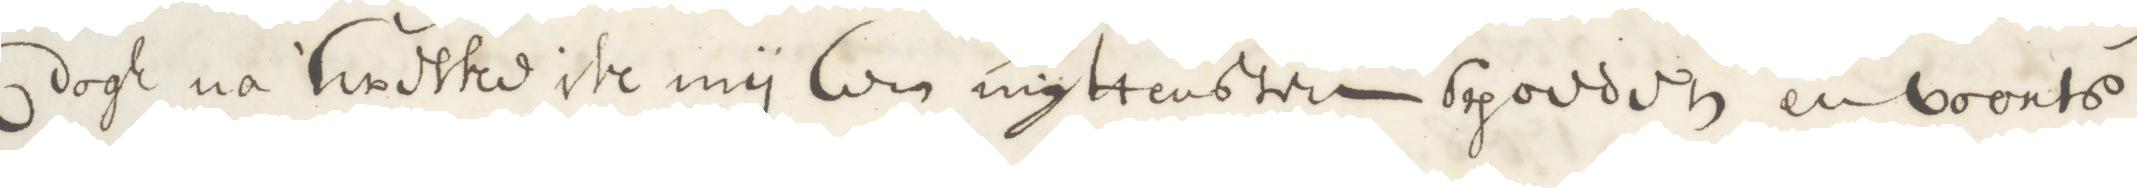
dogh na ’twelke ik mij ten uijttersten spoeden en voorts
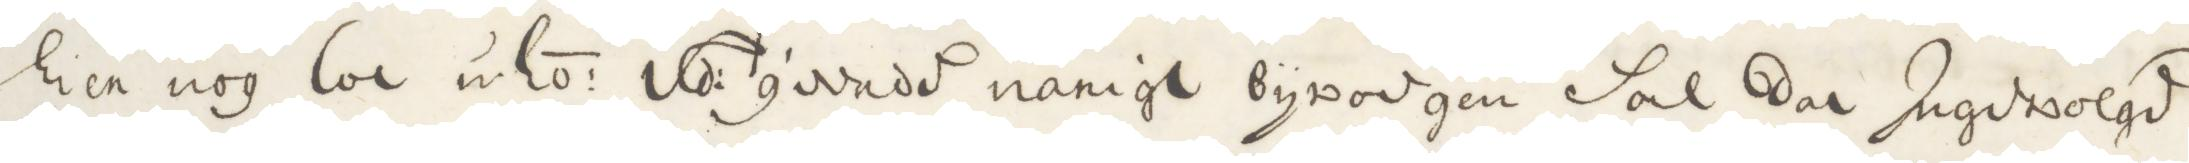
hier nog tot uho: Ed: g’eerde narigt bijvoegen sal dat Jngevolge
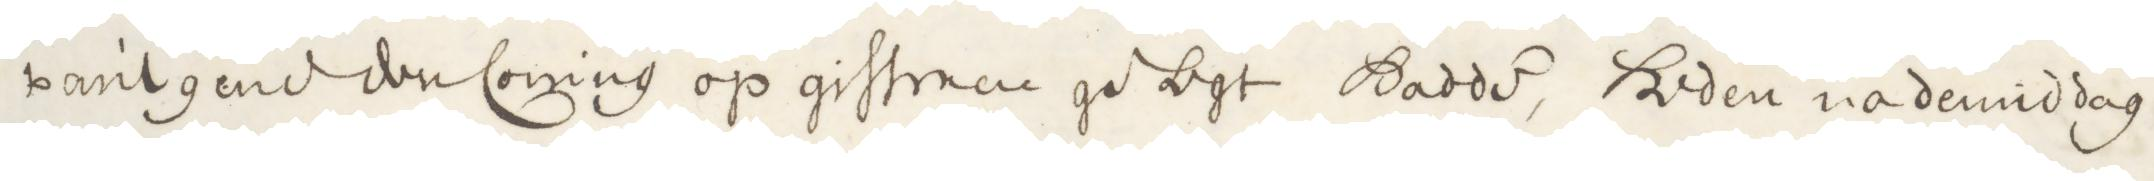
van’t gene den Coning op gisteren gesegt hadde, heden na demiddag
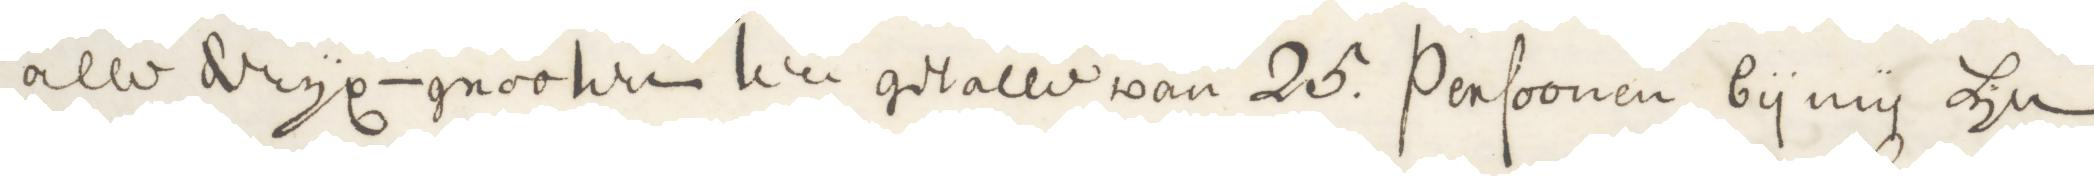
alle derijx-grooten ten getalle van 25. Persoonen, bij mij sijn
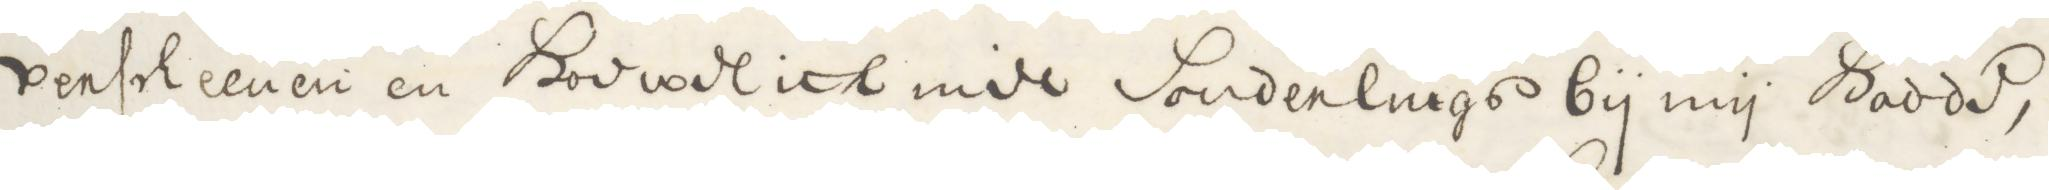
verscheenen en hoewel ick niet sonderlings bij mij hadde,
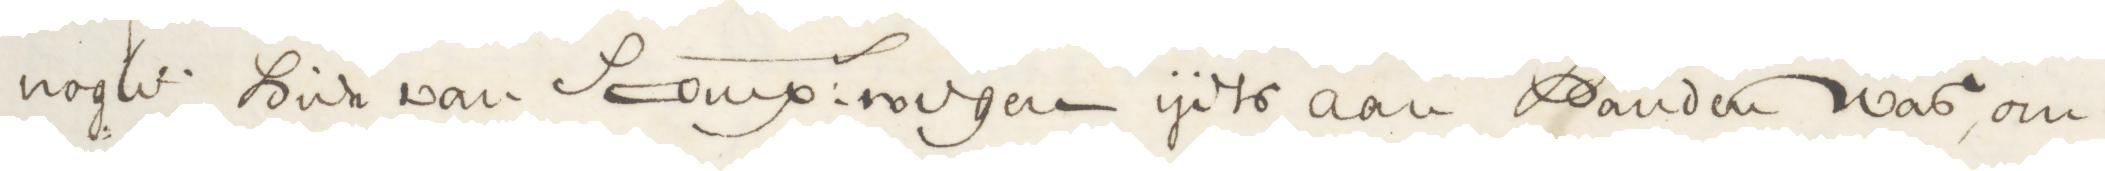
nogte' hier van scomp:s wegen ijets aan handen was, om
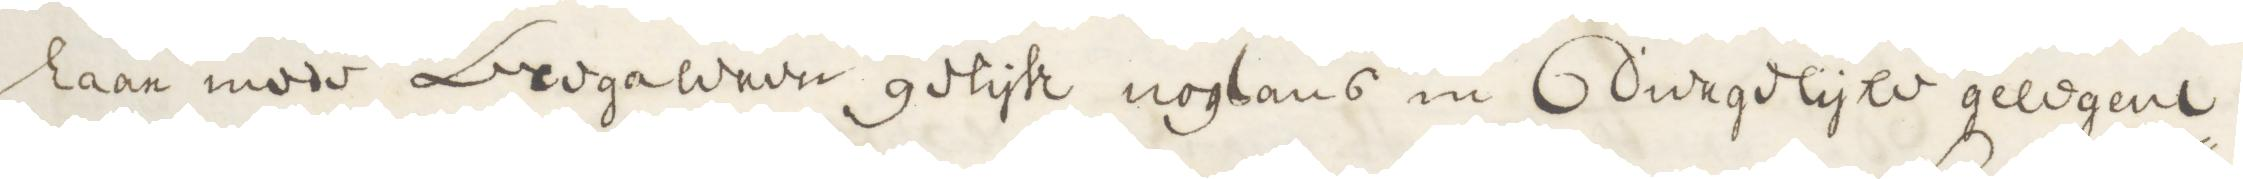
haar mede’ te regaleren gelijk nogtans in diergelijke gelegent„
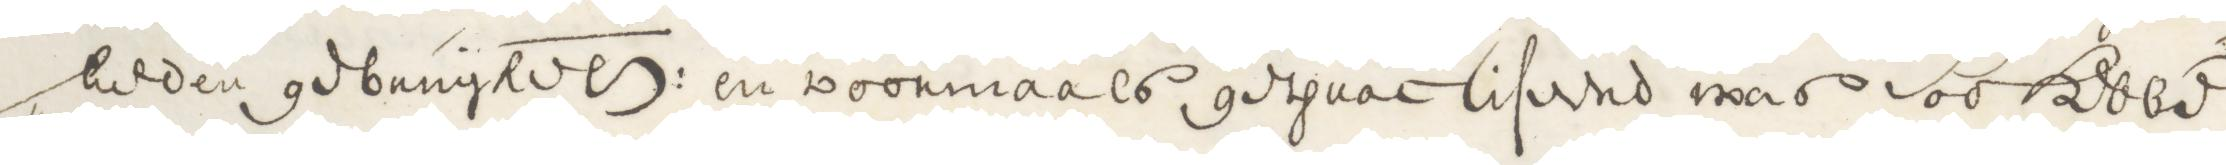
heden gebruijkelijk: en voormaals gepractiseerd was soo hebbe
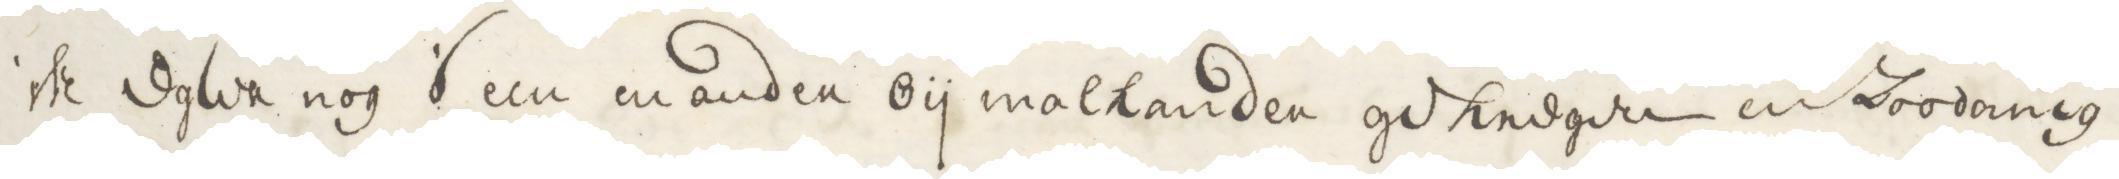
ik egter nog ’t een en ander bij malkander gekregen en Zoodanig
